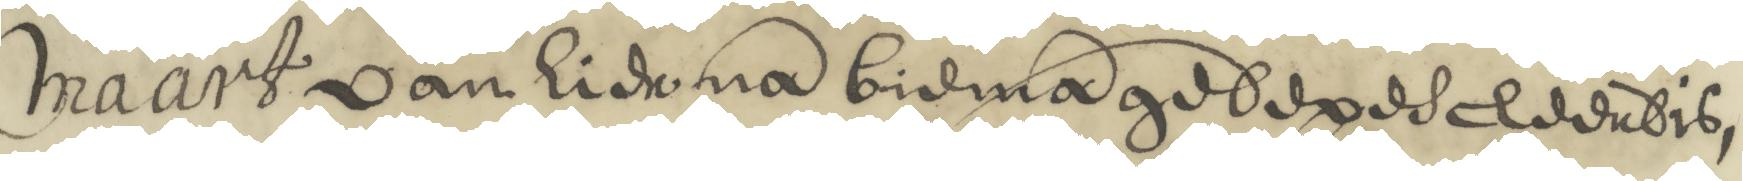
maart van hier na biema gedepescheerd is,
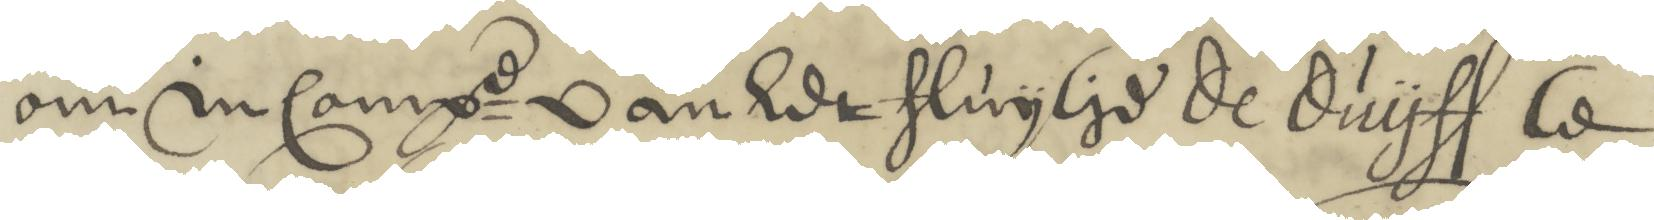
om in Comp=e van het fluijtje de duijff te
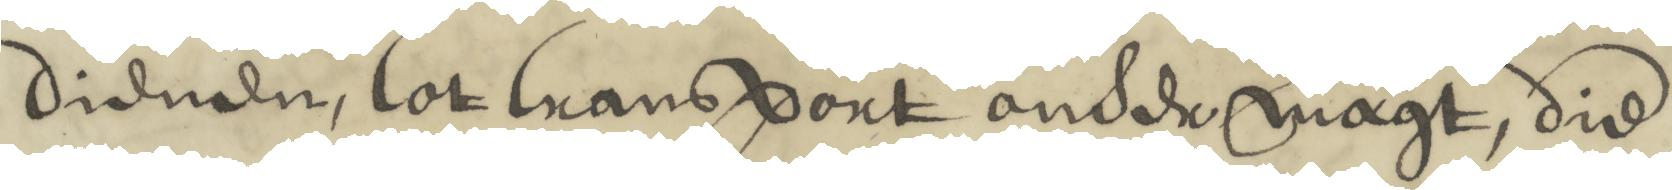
dienen, tot transport onser magt, die
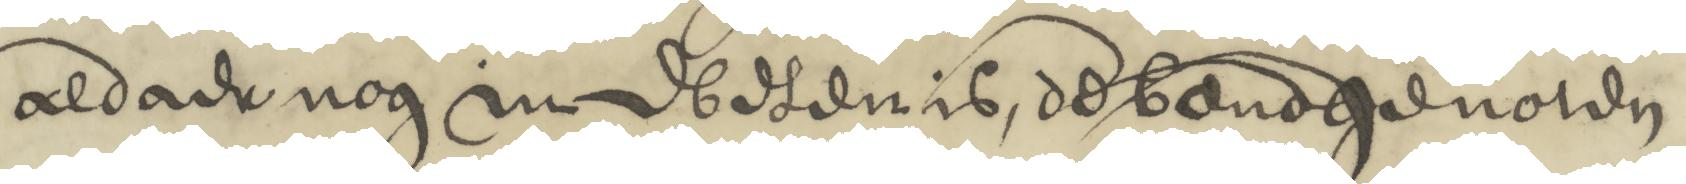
aldaer nog in wesen is, de bondgenoten
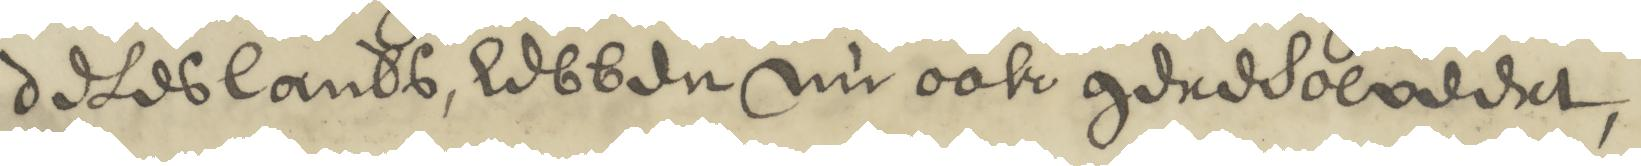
deses lands, hebben nu ook geresolveert,
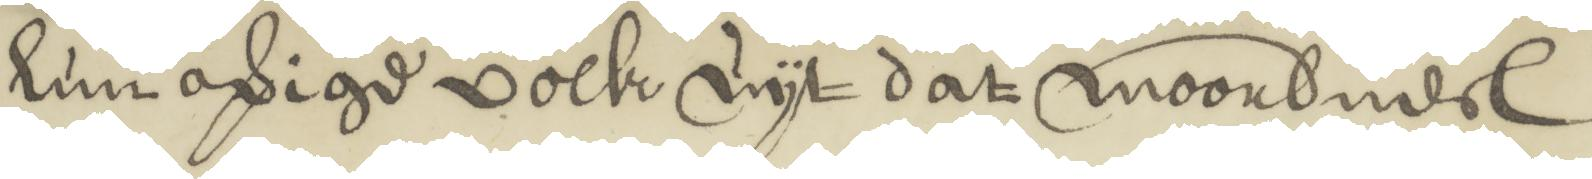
hun overige volk uijt dat moordnest
